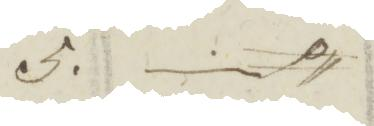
5. _„o
